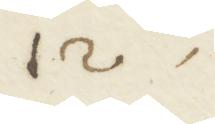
12 /
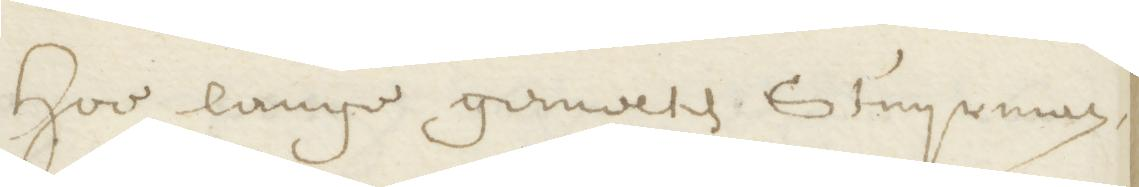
hoe lange gemelten Stuyrman,
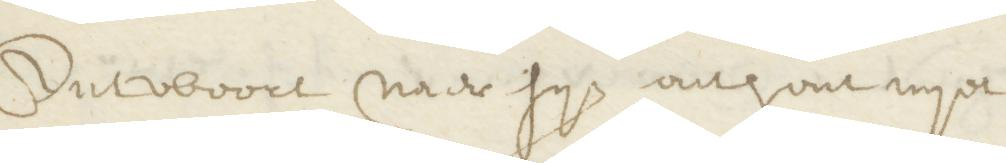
Antwoort naer syn onthout nyet
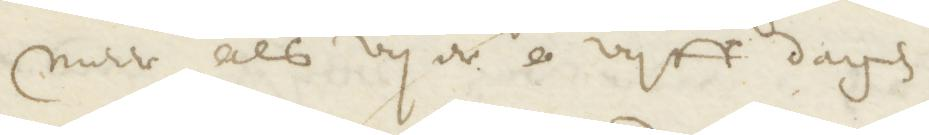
meer als vyer a vyff dagen
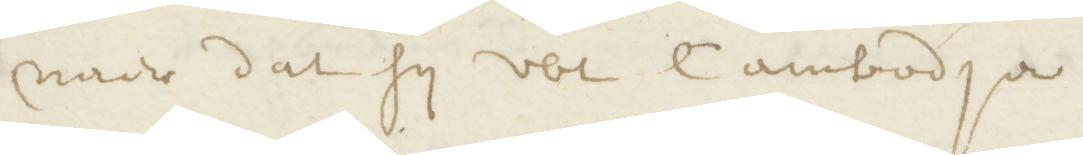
naer dat sy wt Cambodja
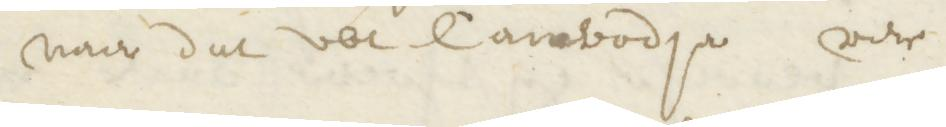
naer dat wt Cambodja ver
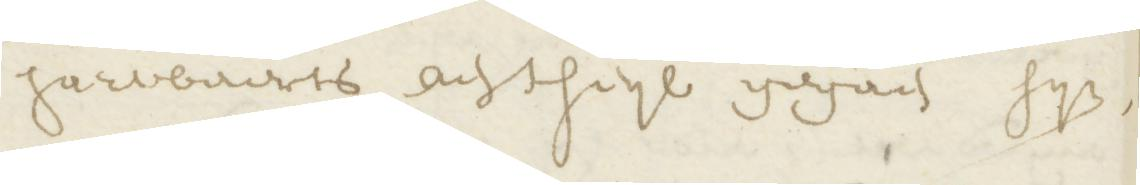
harweerts intseyl gegaen syn
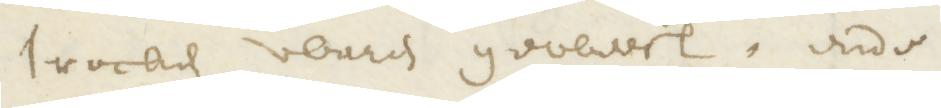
trocken waren geweest, ende
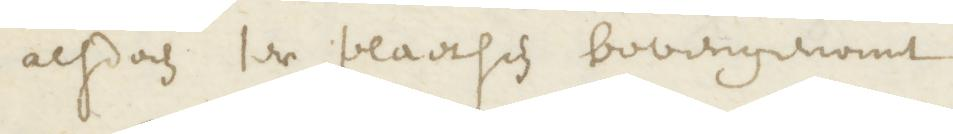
als doen ter plaatsen bovengenomt
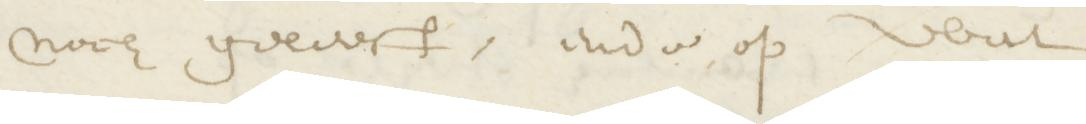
noch geleeft, ende op wat
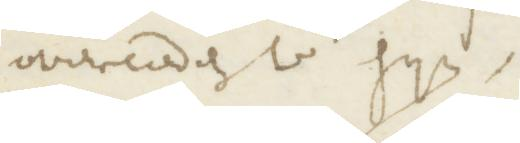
overeen te syn /
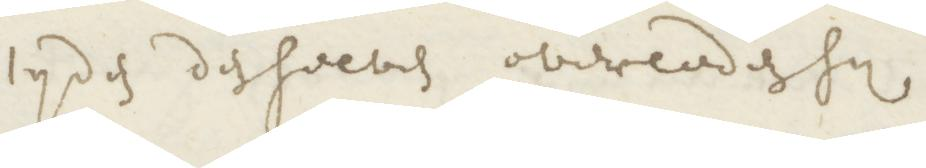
tyden deselven overleden sy
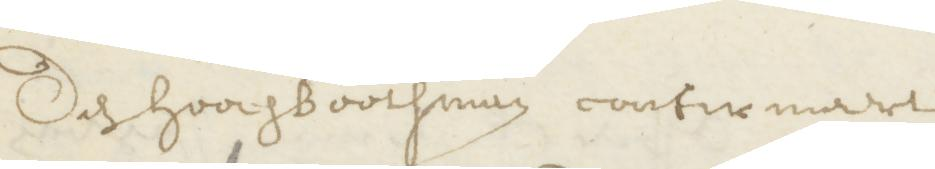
Den hoochbootsman confirmeert
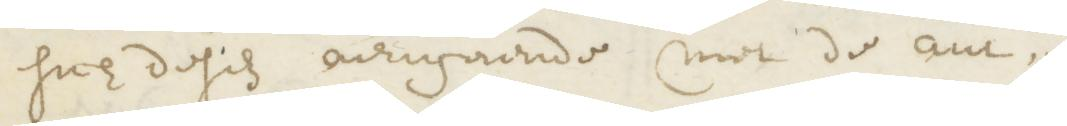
sich desen aengaende met de ant„
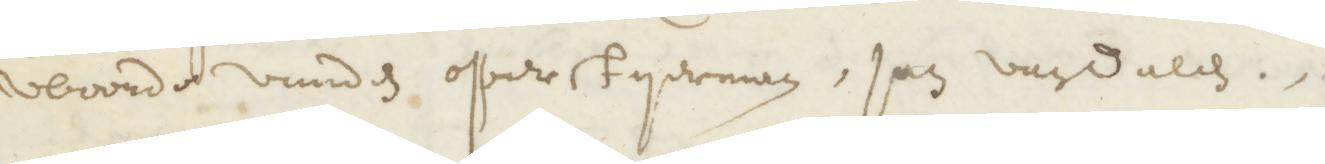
woorde vanden opperstyerman, jan van daelen. /
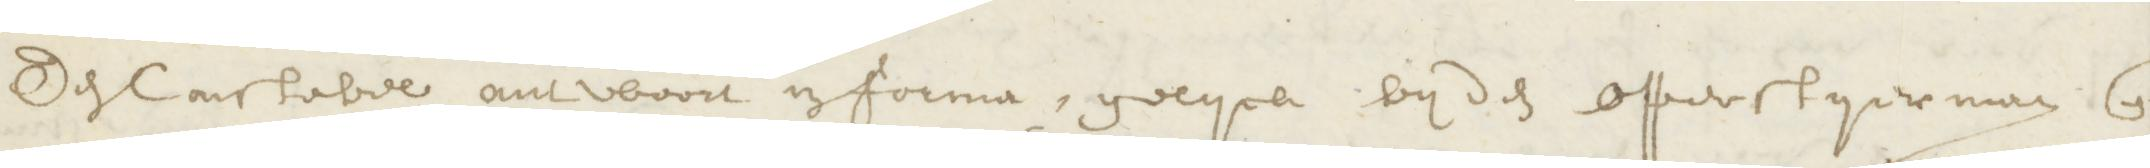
Den Constabel antwoort in forma, gelyck by den opperstyerman ende
